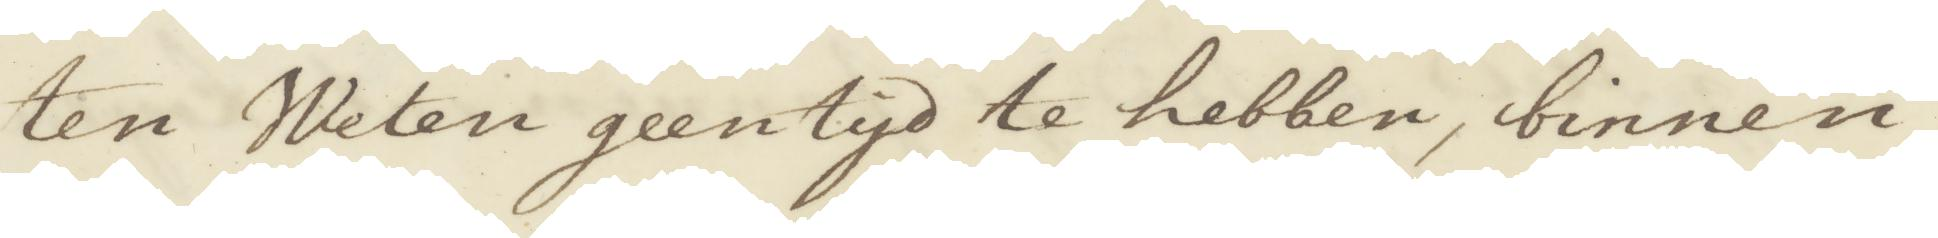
ten weten geen tijd te hebben, binnen
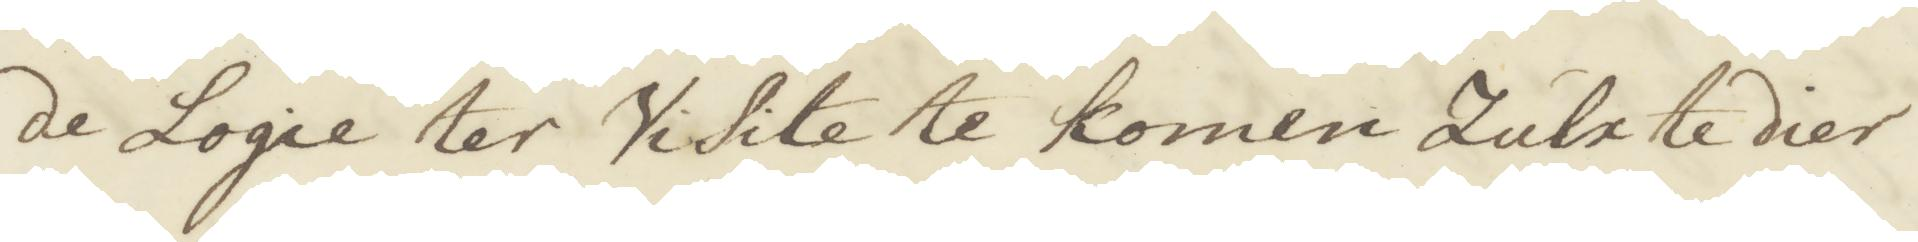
de Logie ter visite te komen zulx te dier
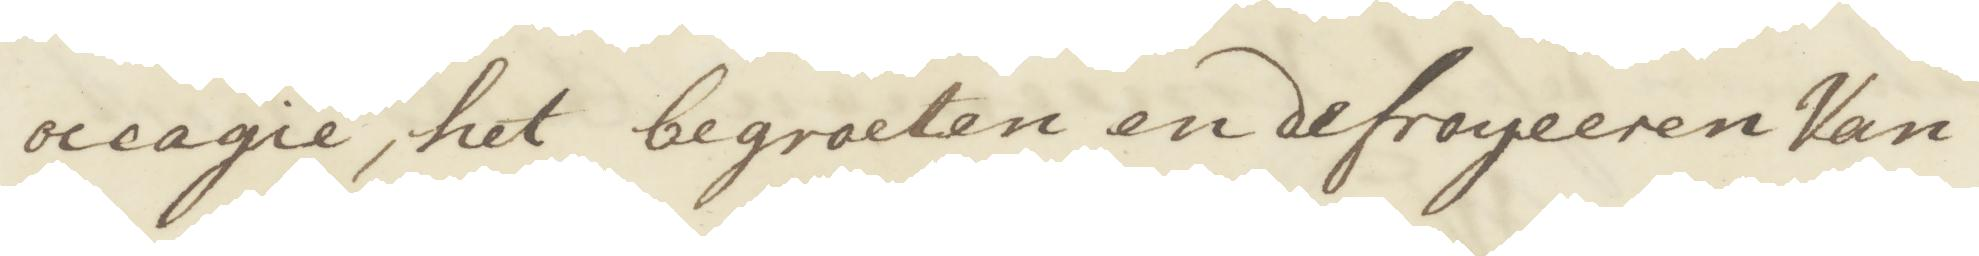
occagie, het begroeten en defroyeeren van
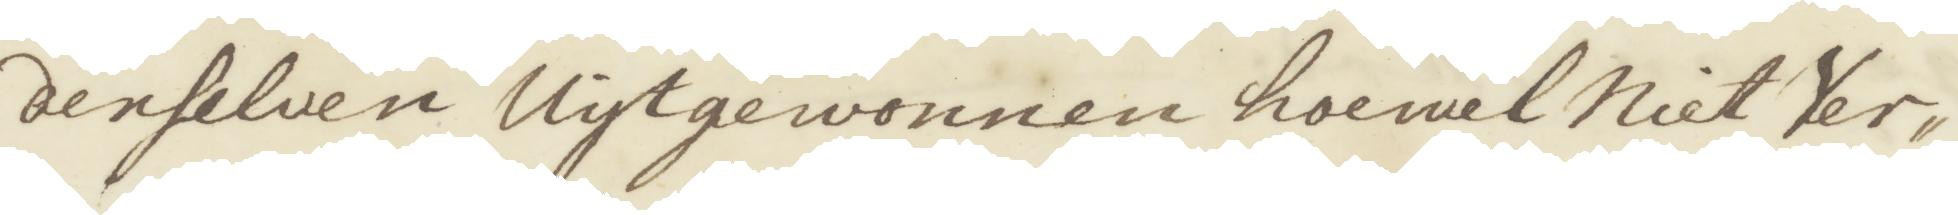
derselven uijtgewonnen hoewel niet ver„
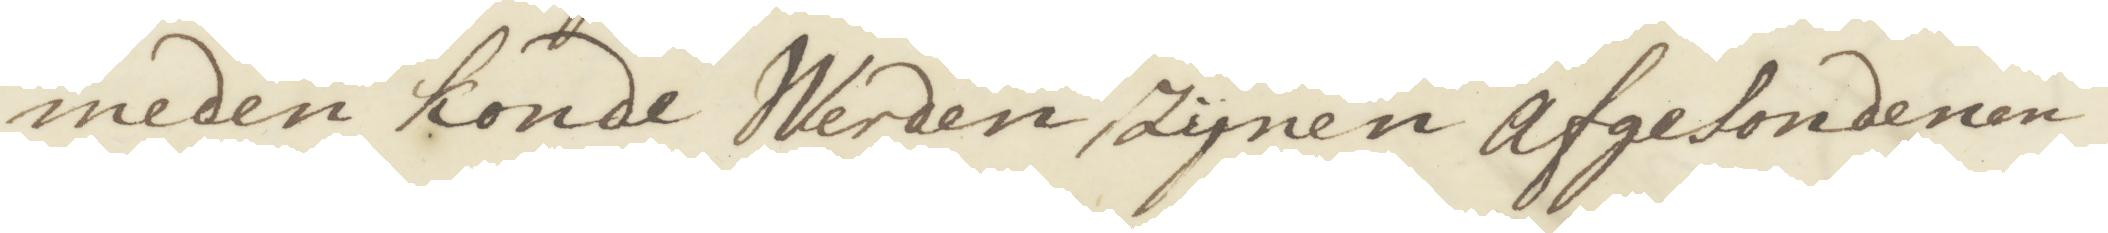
meden konde werden, zijnen afgesondenen
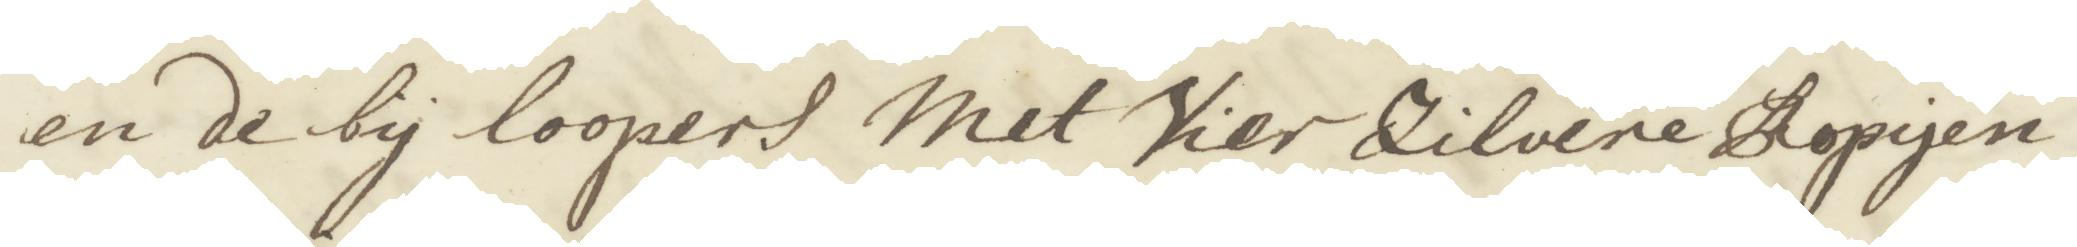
en de bij loopers met vier zilvere Ropijen
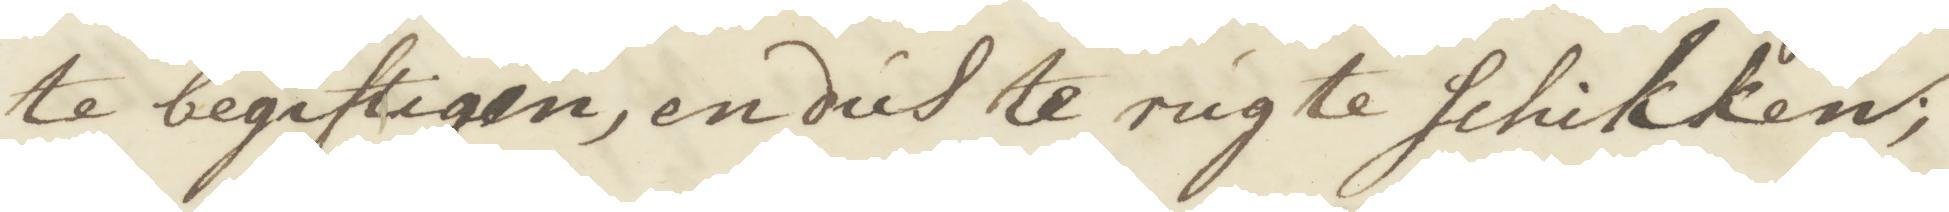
te begiftigen, en dus te rug te schikken;
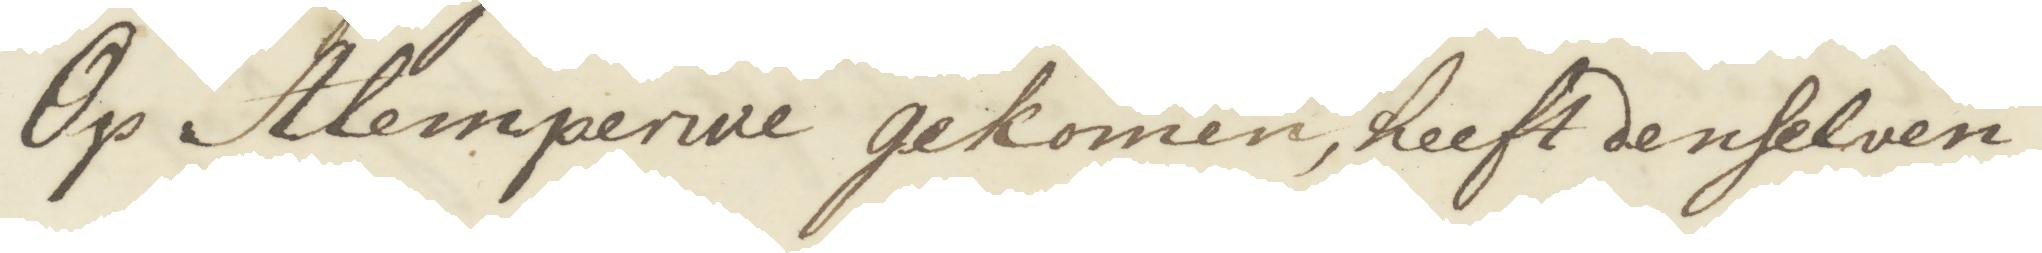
Op Alemperwe gekomen, heeft denselven
